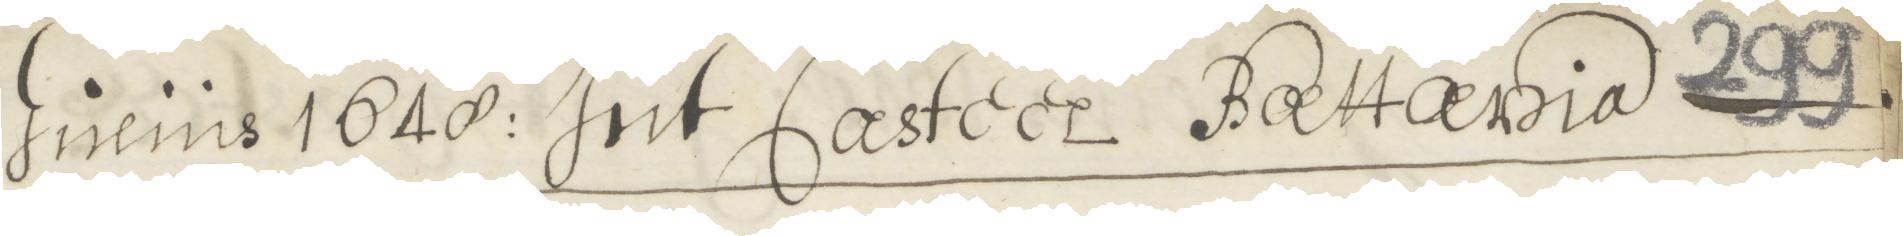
Iulius 1648: Int Casteel Battavia 299.
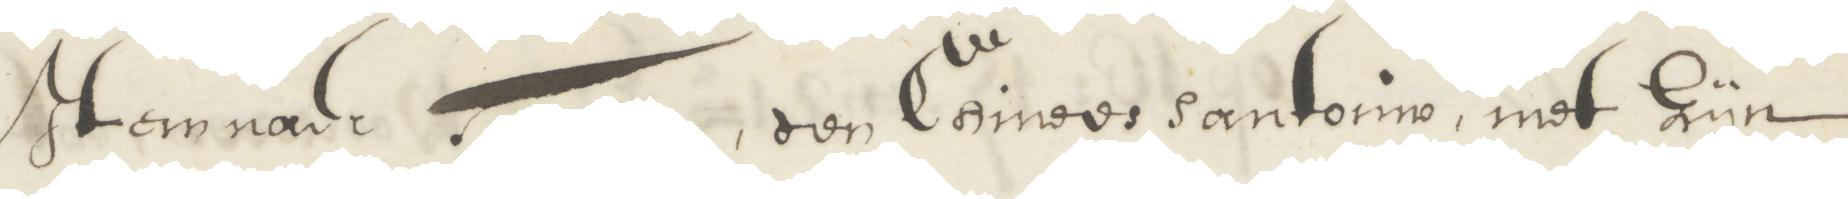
Item naer Taijouan, den Chinees santouw, met zijn
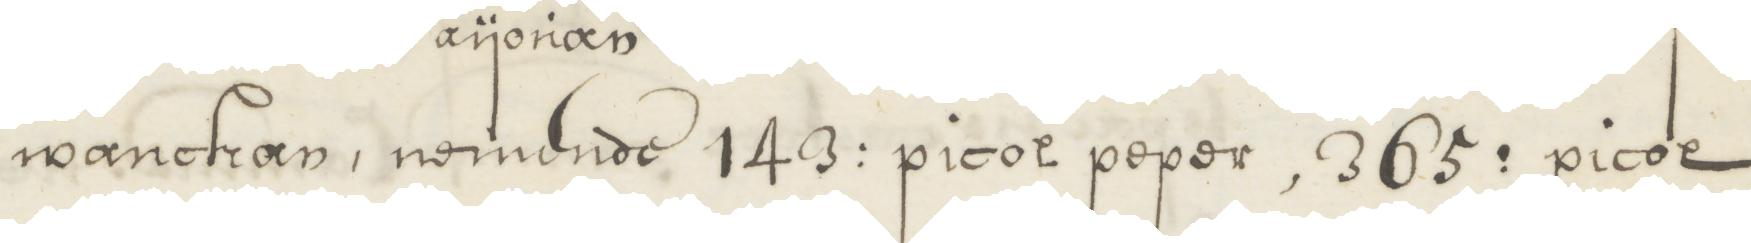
wanckan, nemende 143: picol peper, 365: picol
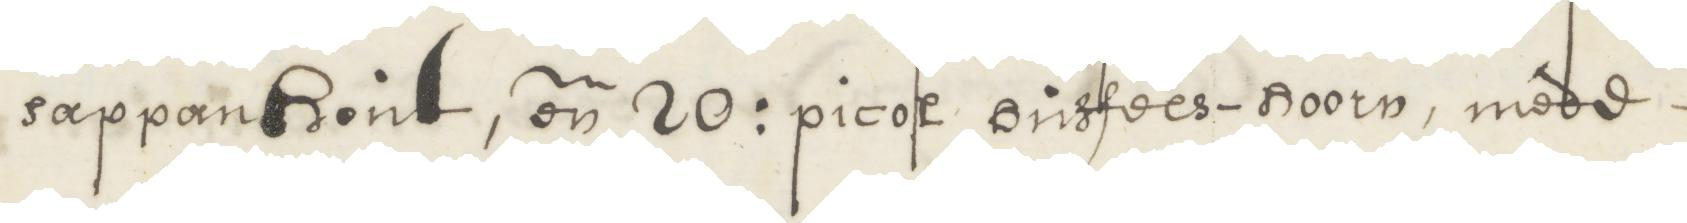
sappanhout, en 20: picol buffels-hoorn, mede
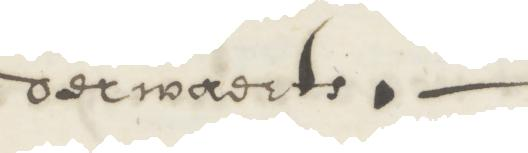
derwaerts.—
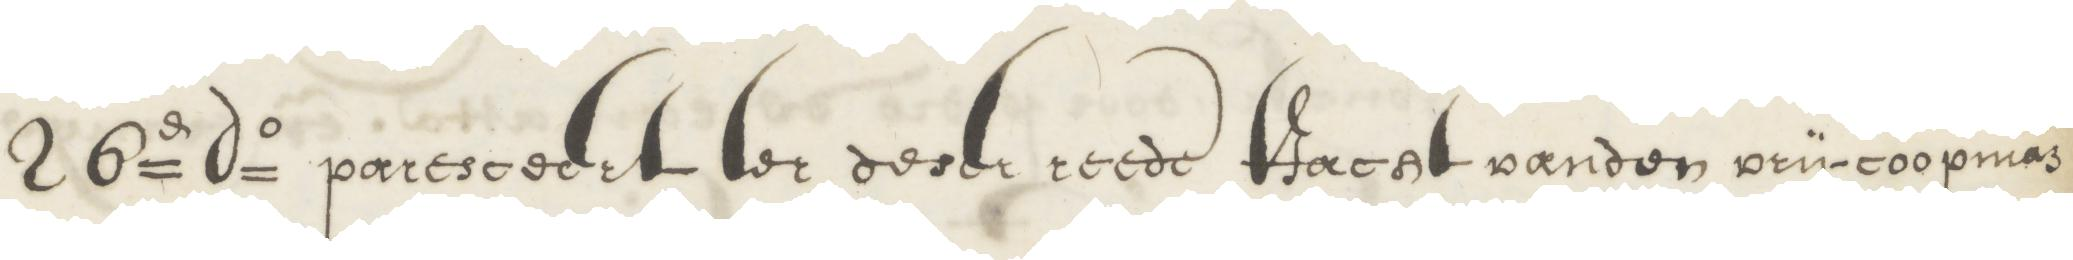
26=e d=o paresceert ter deser reede tIacht vanden vrij-coopman
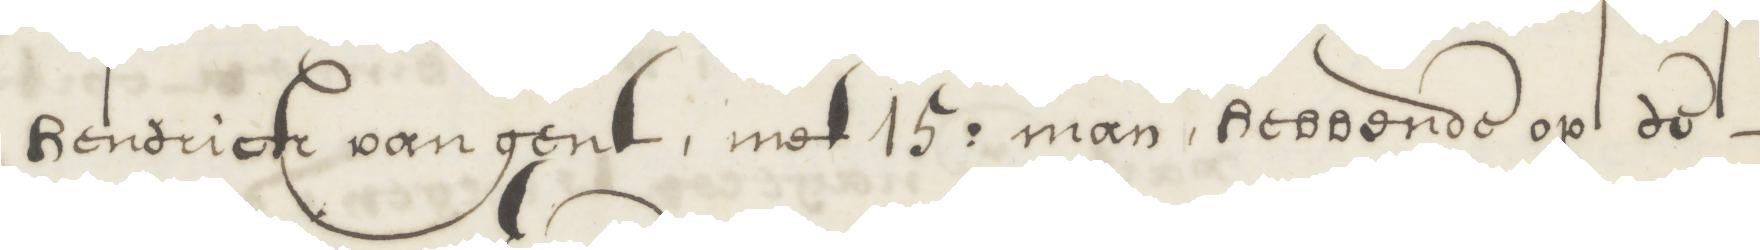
hendrick van gent, met 15: man, hebbende op de
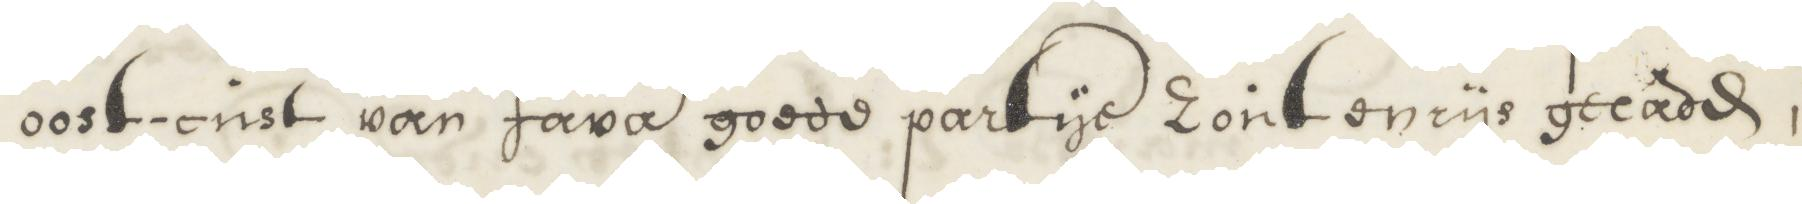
oost-cust van Java goede partije zout en rijs geladen,
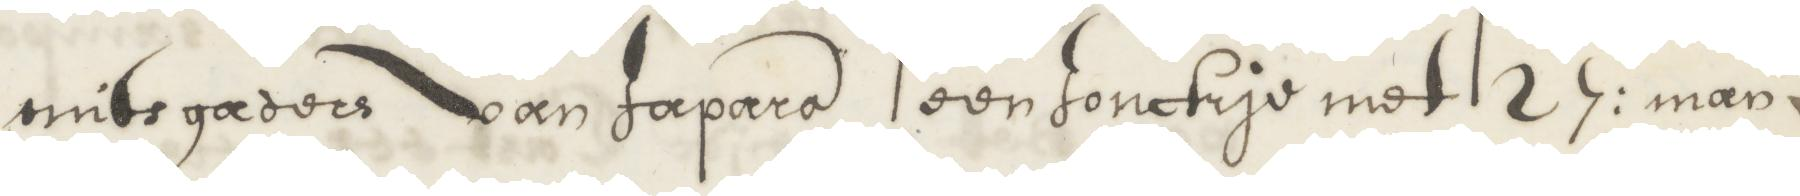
mitsgaders van Japaro een Ionckje met 27: man
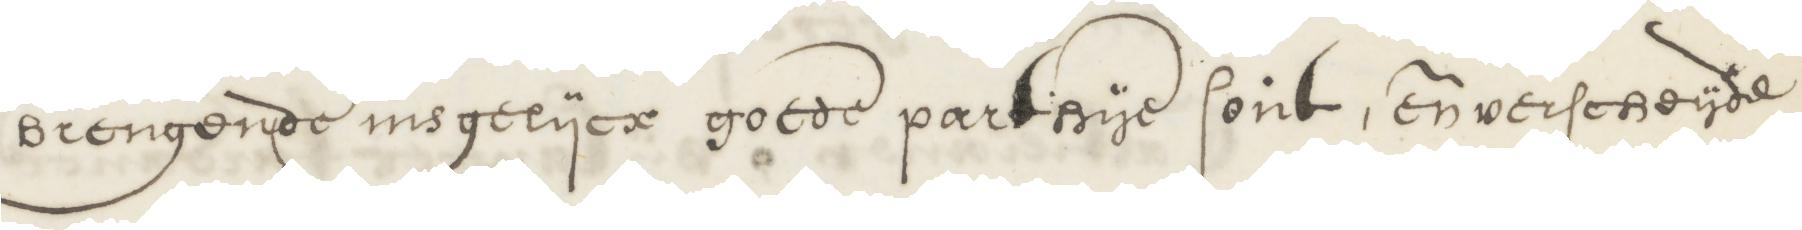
brengende insgelijcx goede parthije sout, en verscheijde
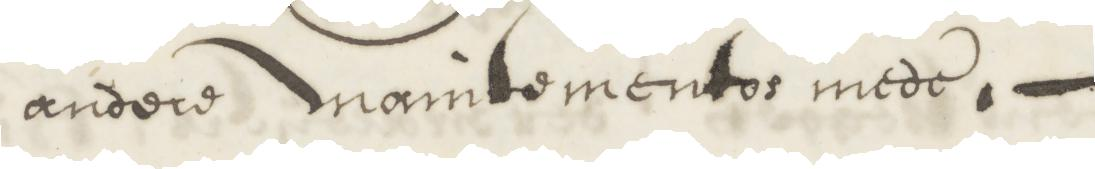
andere maintementos mede. —
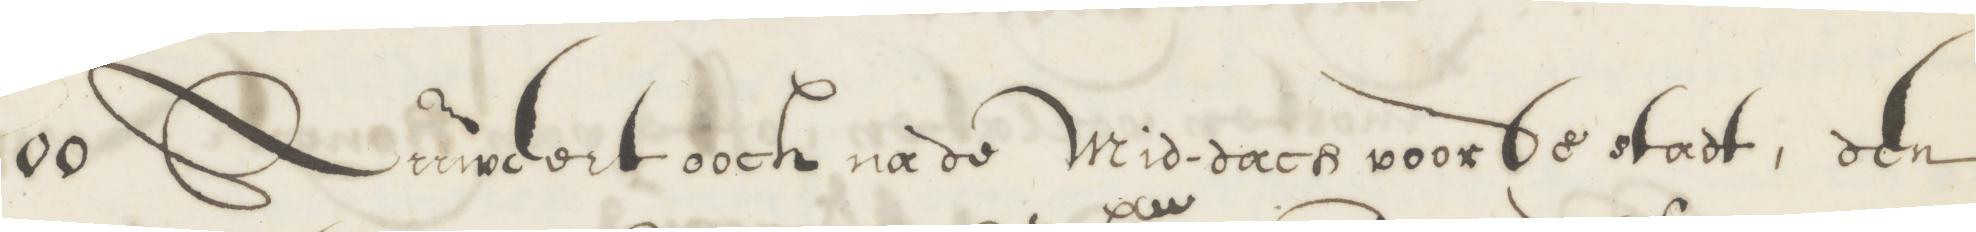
oo Arriveert oock na de mid-dach voor de stadt, den
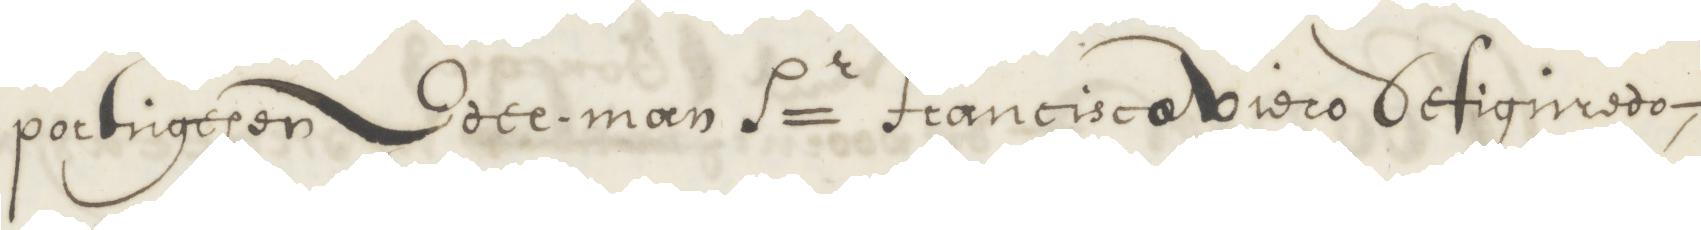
portugesen Edel-man S=r Francisco Viero defiguredo,
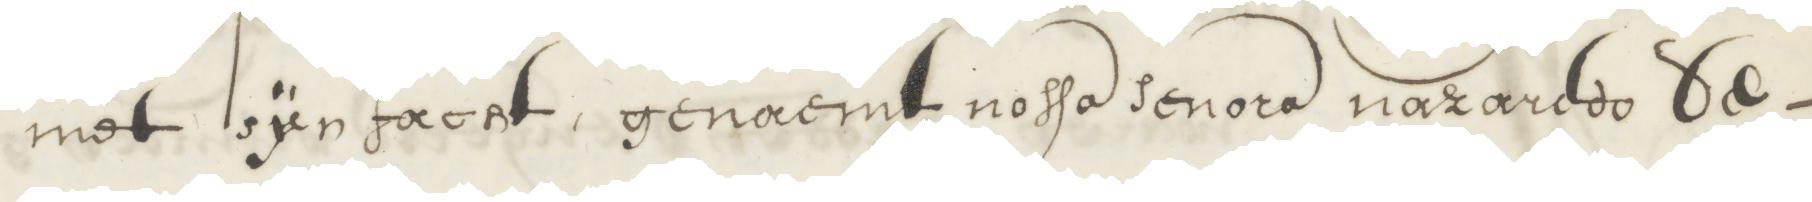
met sijn Jacht, genaemt nossa senora nazaredo de
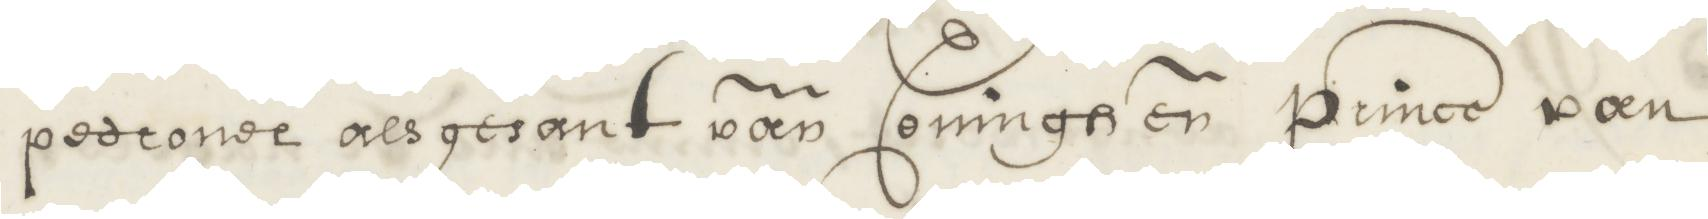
pedronel als gesant van Coningh en Prince van
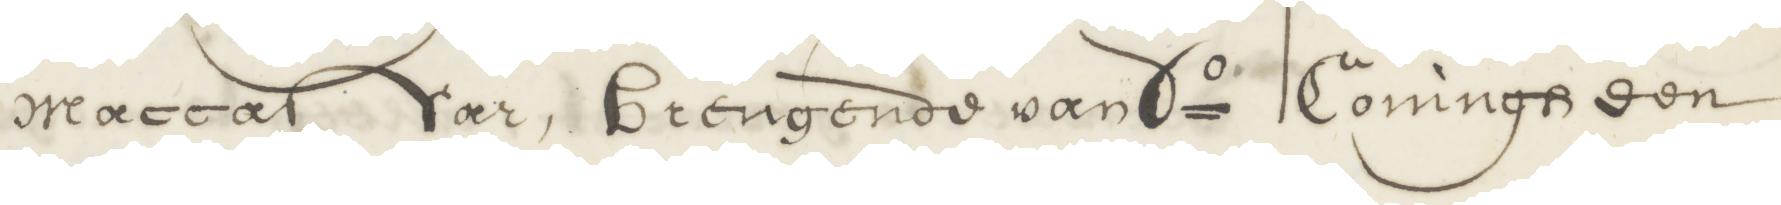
Maccassar, brengende van d=o Coningh een
